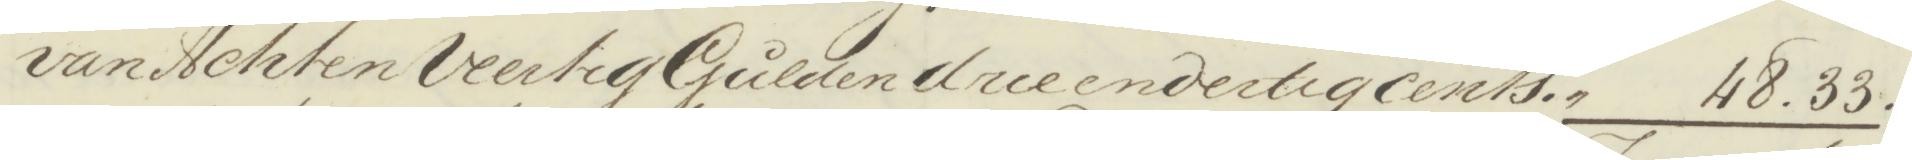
van Achten Veertig Gulden drie en dertig cents. „ 48.33.
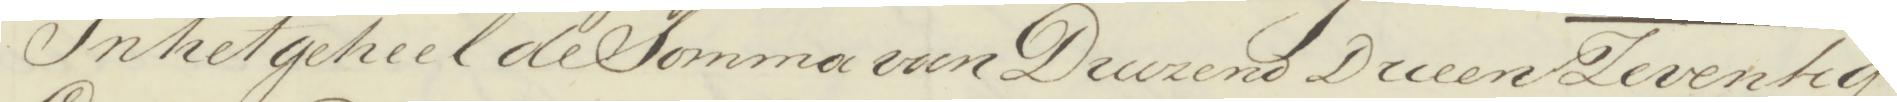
In het geheel de Somma van Duizend Drieen Zeventig
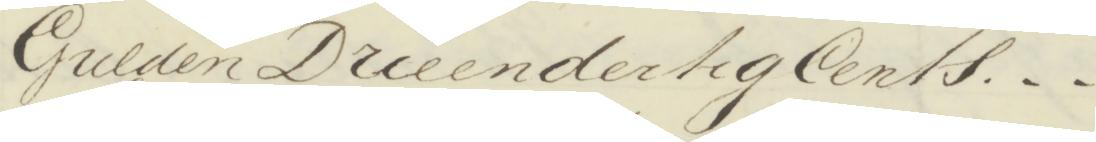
Gulden Drieendertig Cents.
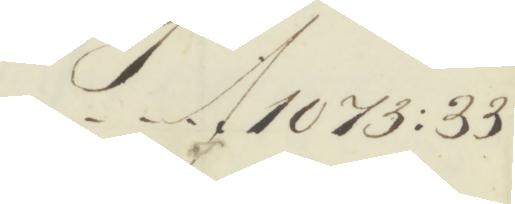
ƒ1073:33
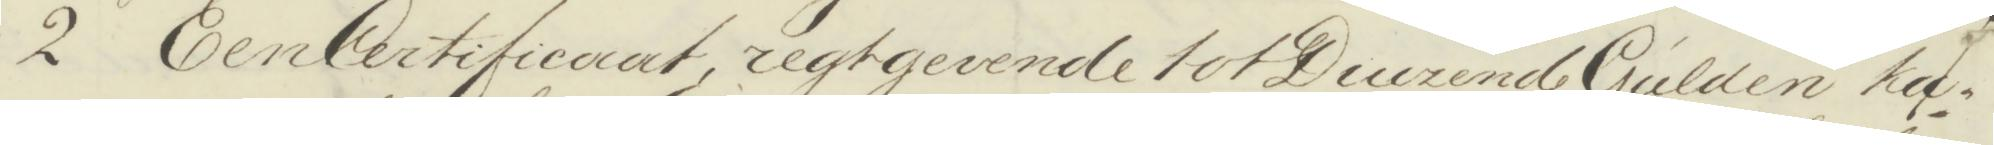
2 Een Certificaat, regt gevende tot Duizend Gulden ka„
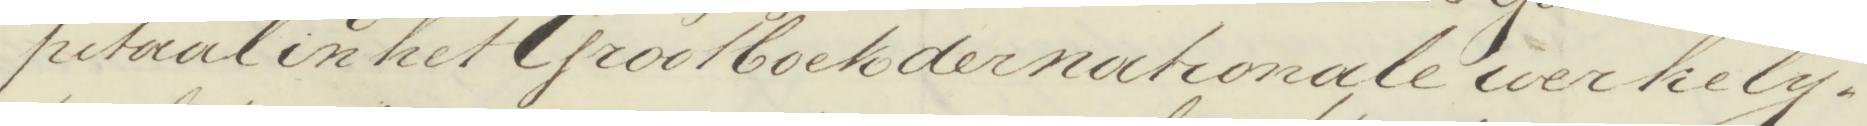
pitaal in het Grootboek der nationale werkely„
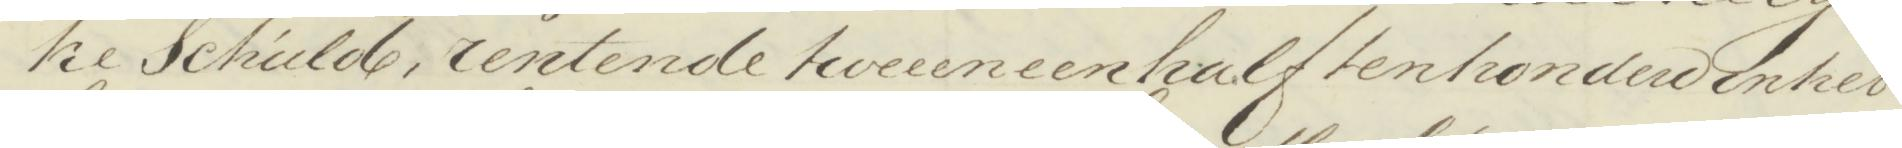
ke schuld, rentende tweeeneenhalf ten honderd in het
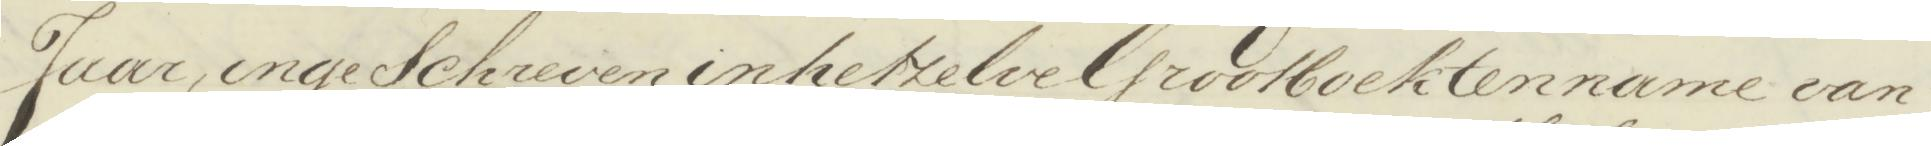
Jaar, ingeschreven in hetzelve Grootboek ten name van
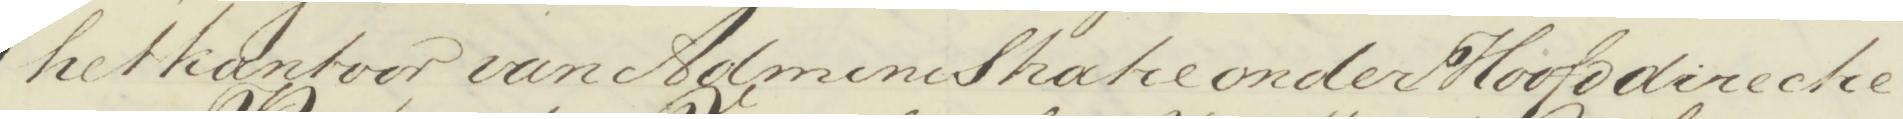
het kantoor van Administratie onder Hoofddirectie
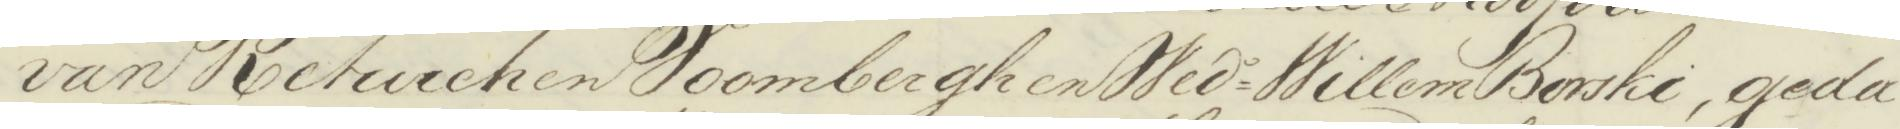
van Returch en Voombergh en Wed=u Willem Borki, geda
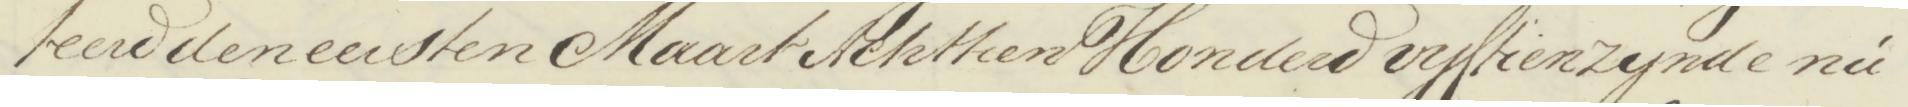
teerd den eersten Maart Achttien Honderd vyftien zynde nu
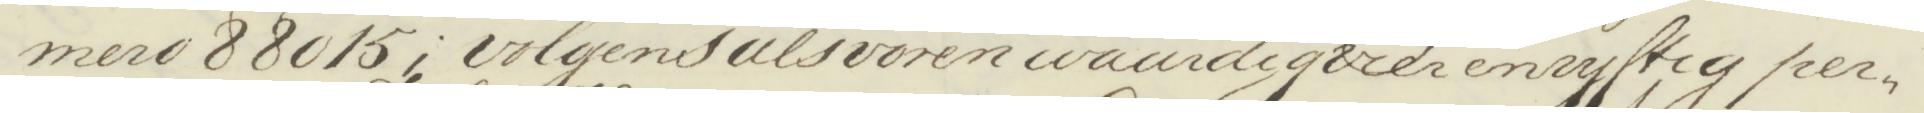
mero 88015; volgens als voren waardig vier en vyftig per„
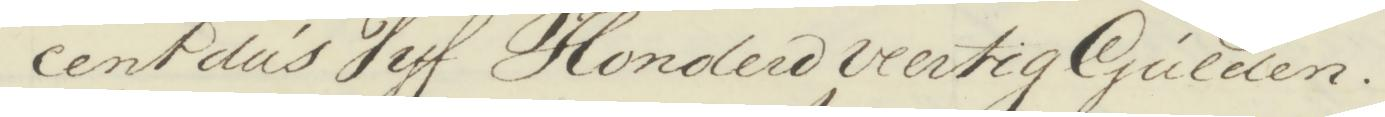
cent dus Vyf Honderd veertig Gulden.
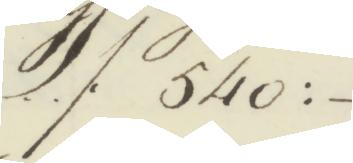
ƒ 540:
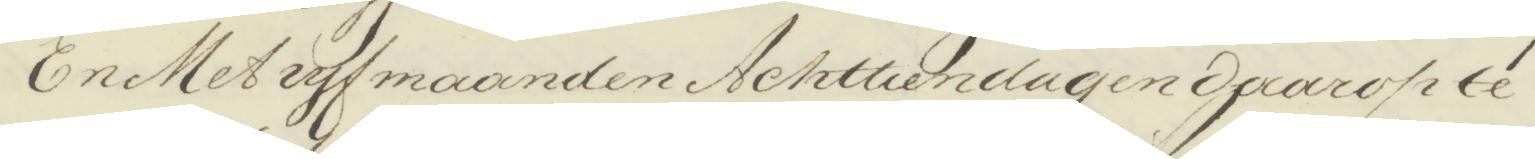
En Met vyf maanden Achttien dagen daarop te
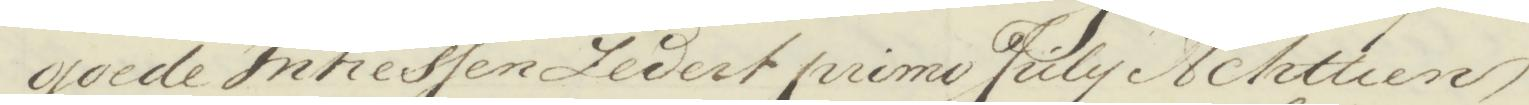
goede Intressen Zedert primo Julij Achtien,
